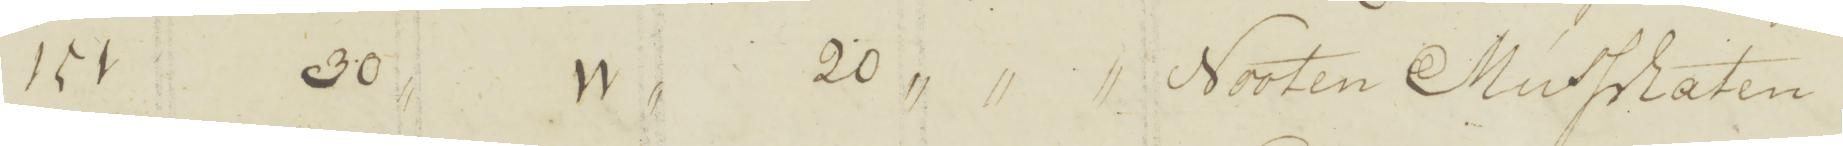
151 30 „ 11 „ 20 „ „ „ Nooten Musschaten
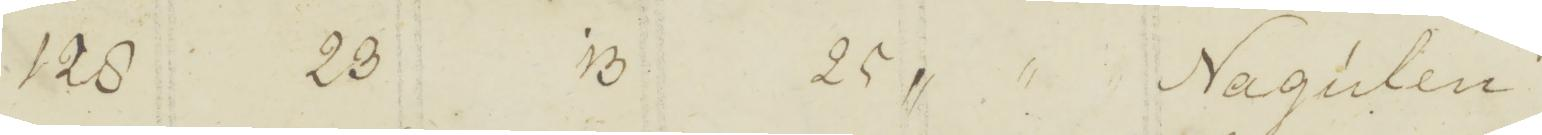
128 23 13 25„ „ Nagulen
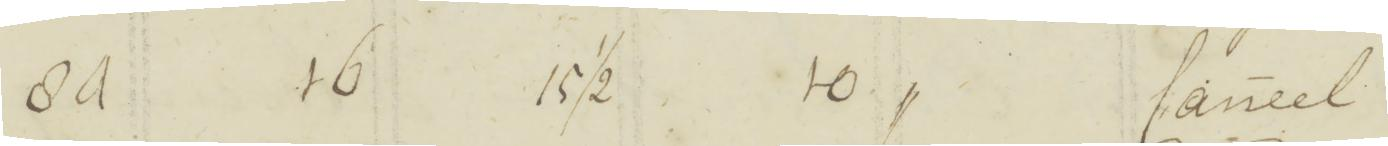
84 16 15½ 10 „ Caneel
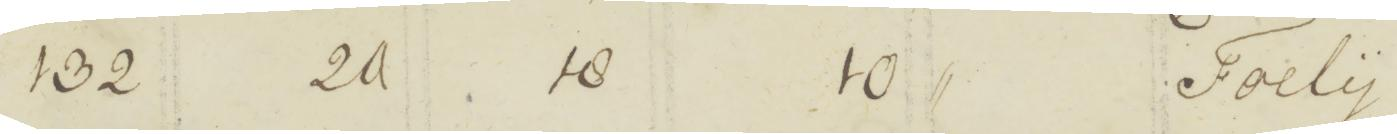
132 24 18 10 „ Foelij
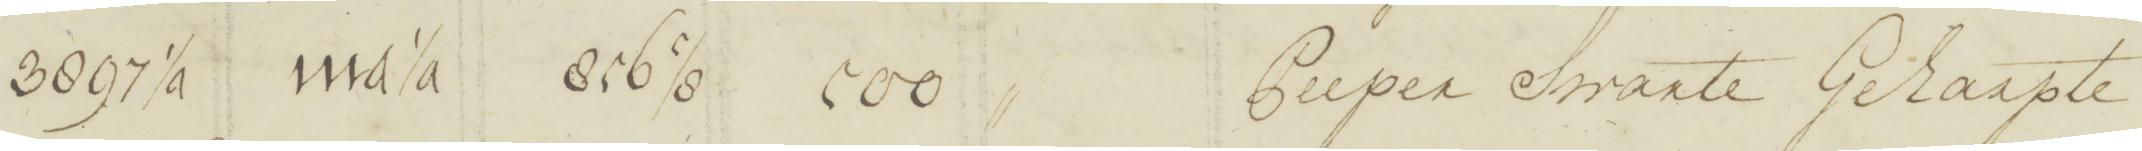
3897¼ 1114¼ 856 5/8 500 „ Peeper swarte Geharpte
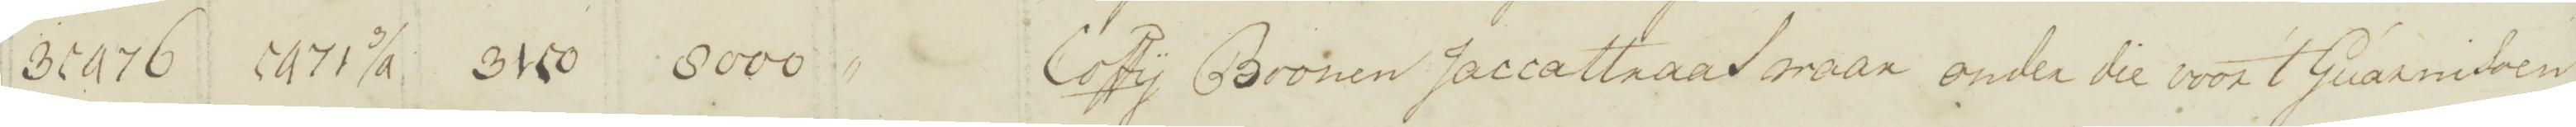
35476 5471¾ 3150 8000 „ Coffij Boonen Jaccattraas waar onder die voor ’t Guarnisoen
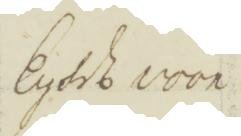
Eysch voor
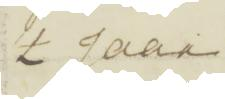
t Jaar
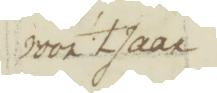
voor ’t Jaar
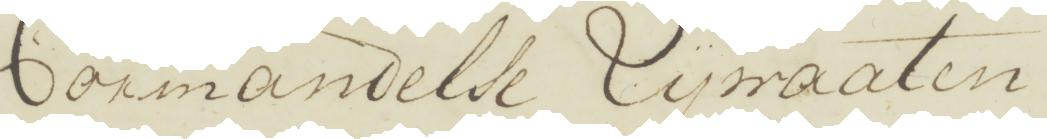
Cormandelse Lijwaaten
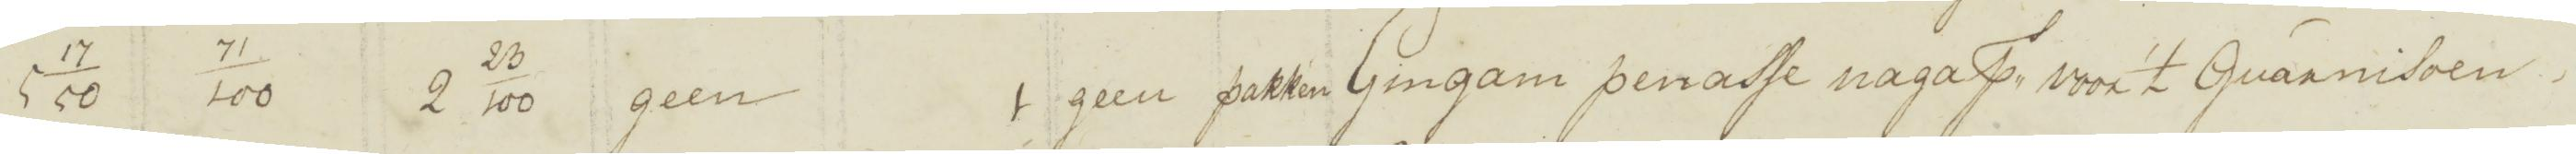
5 17/50 71/100 2 23/100 geen 1 geen pakken Gingam penasse nagap„s voor ’t Guarnisoen
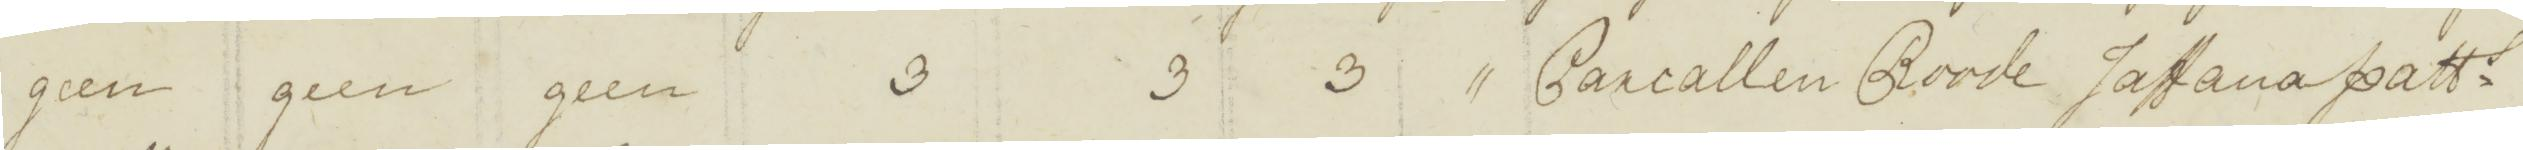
geen geen geen 3 3 3 „ Parcallen Roode Jaffana patt=s
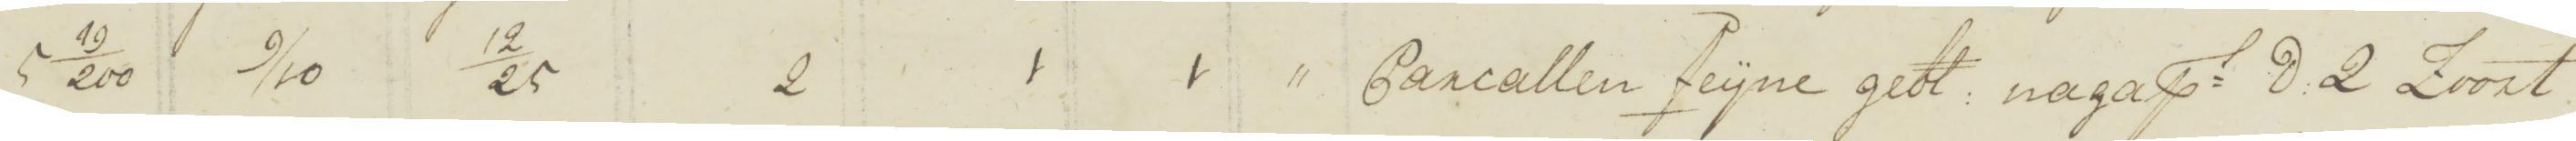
5 19/200 9/10 12/25 2 1 1 „ Parcallen feijne gebl: nagap=s d: 2 zoort
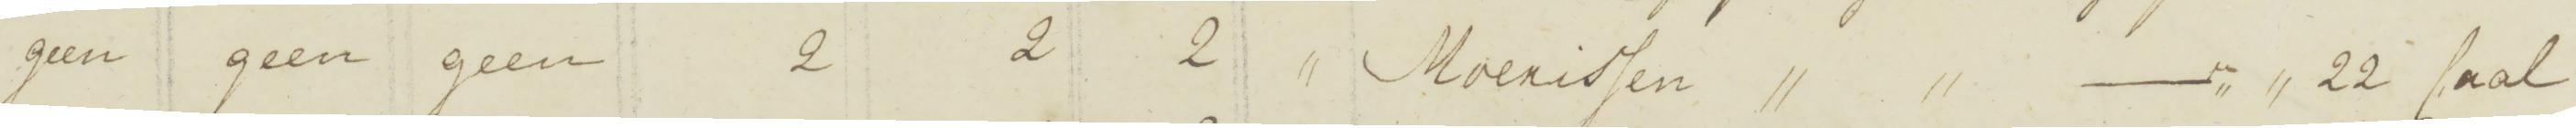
geen geen geen 2 2 2 „ Moerissen „ „ _„o „ 22 caal
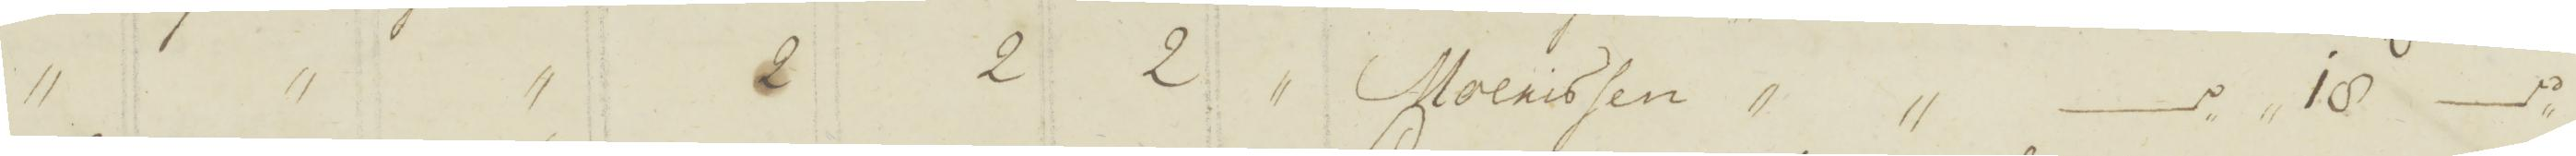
„ „ „ 2 2 2 „ Moerissen „ „ _„o „ 18 _„o
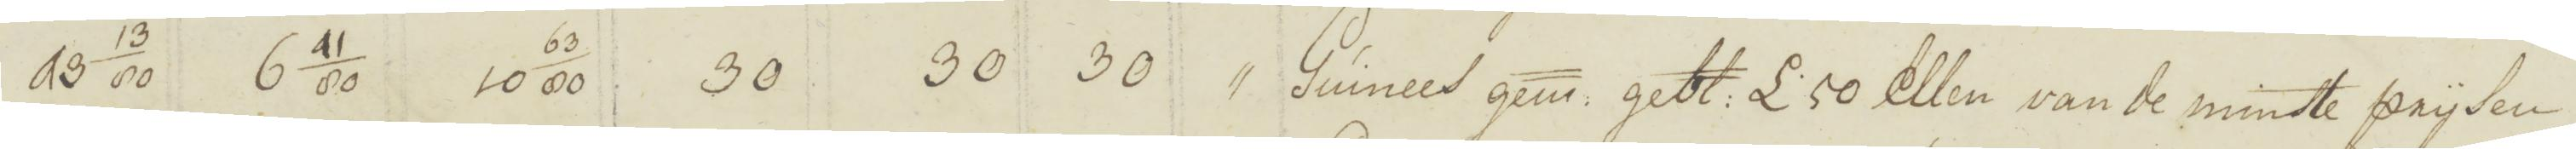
43 13/80 6 41/80 10 63/80 30 30 30 „ Guinees gem: gebl: L 50 Ellen van de minste prijsen
